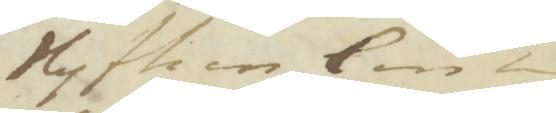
Vyftien Cents
